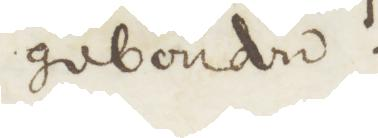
gebonden
